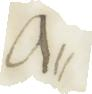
4„
